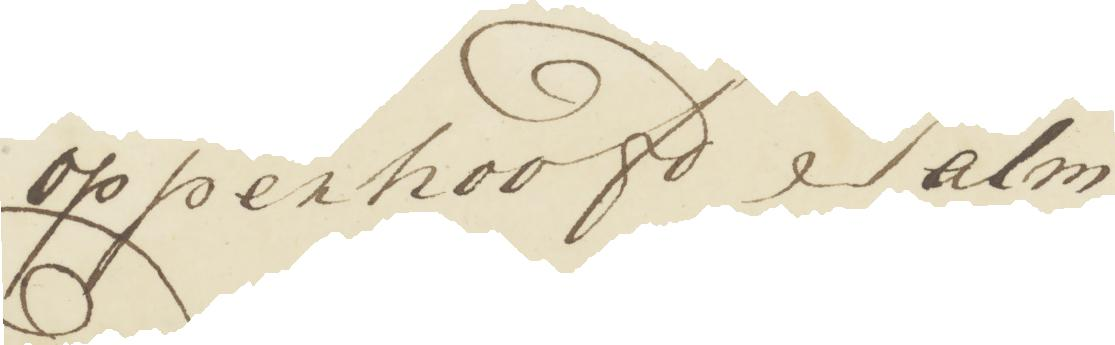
opperhoofd Palm
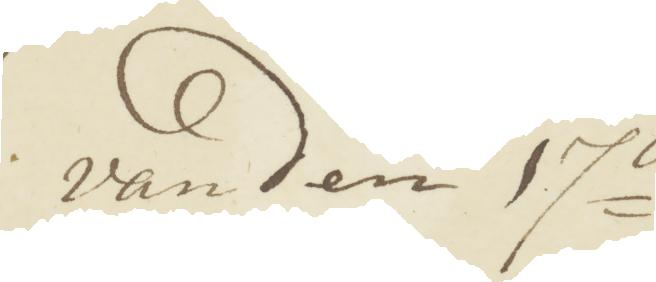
„ 6„ _:o van den 17=den May de„
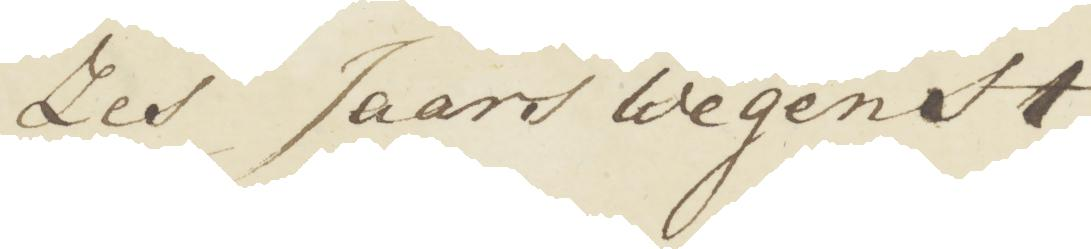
zes Jaars wegens t
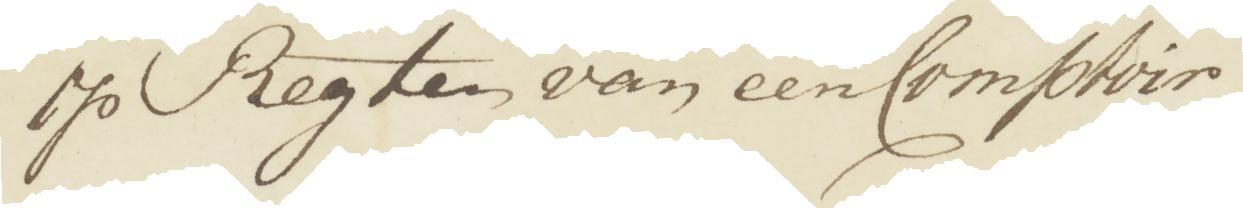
op Regten van een Comptoir
